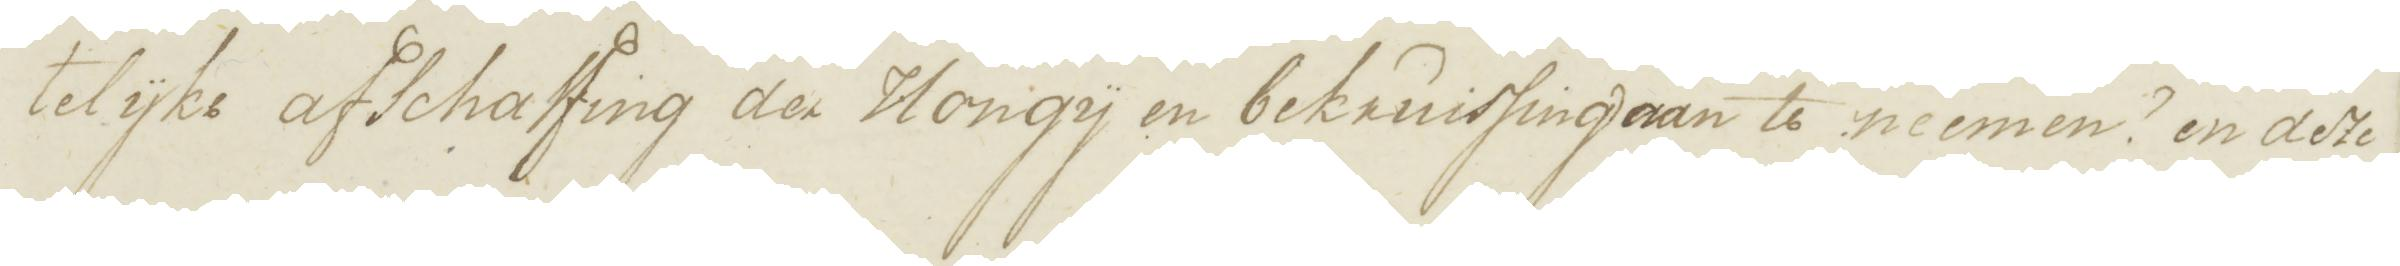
telijke afschaffing der Hongij en bekruissing aan te neemen? en deze
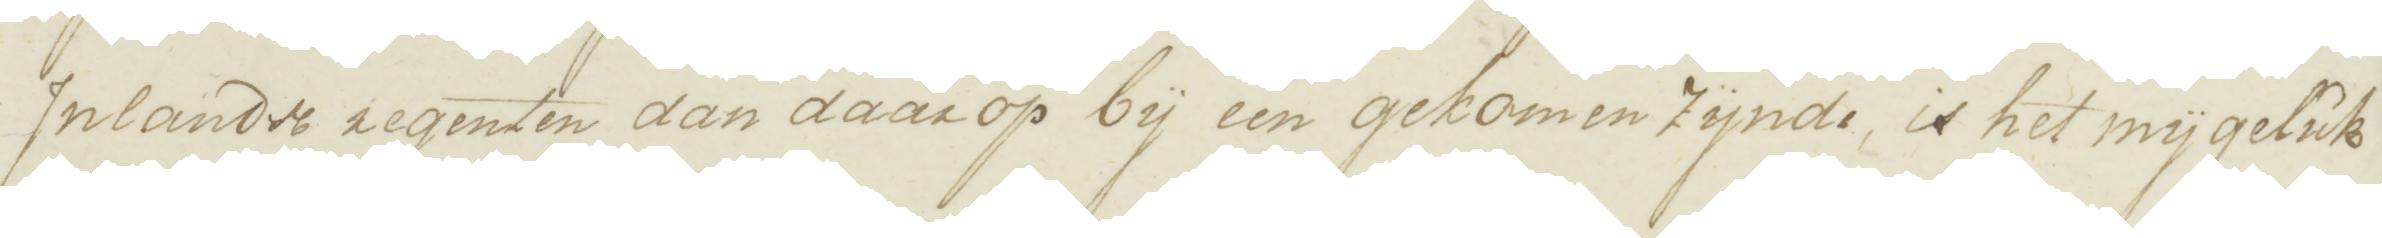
Jnlandse regenten dan daar op bij een gekomen zijnde, is het mij geluk
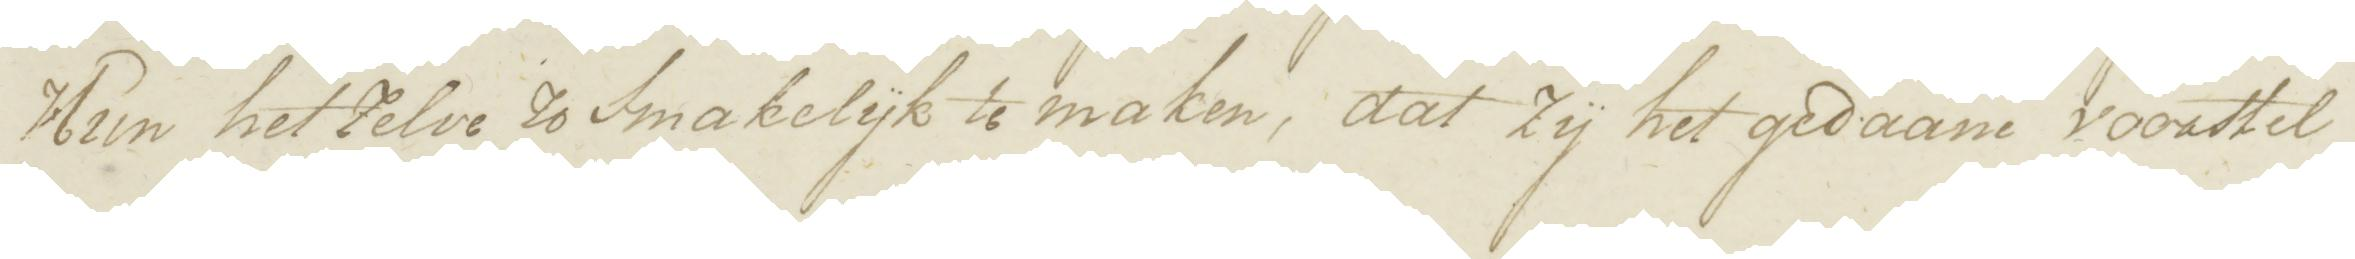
Hun het zelve zo smakelijk te maken, dat zij het gedaane voorstel
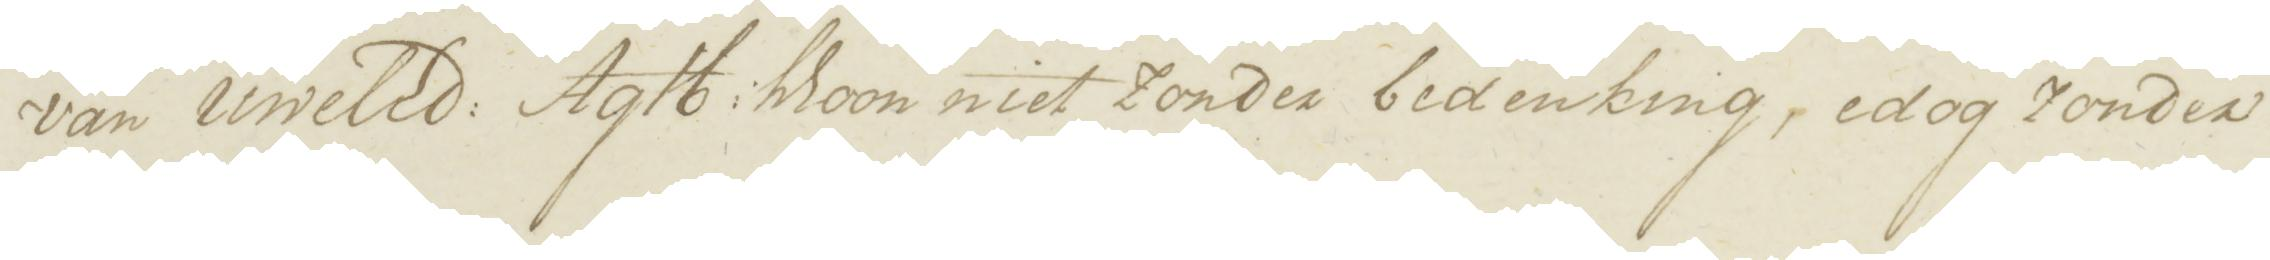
van UwelEd: Agtb: schoon niet zonder bedenking, edog zonder
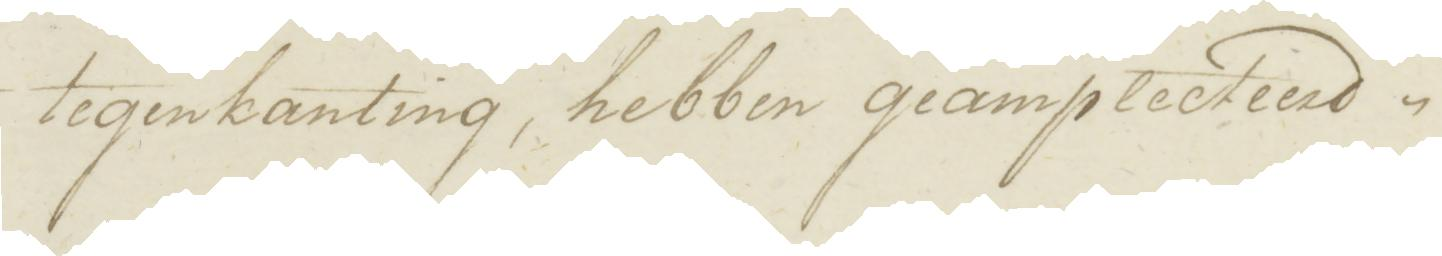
tegenkanting, hebben geamplecteerd -
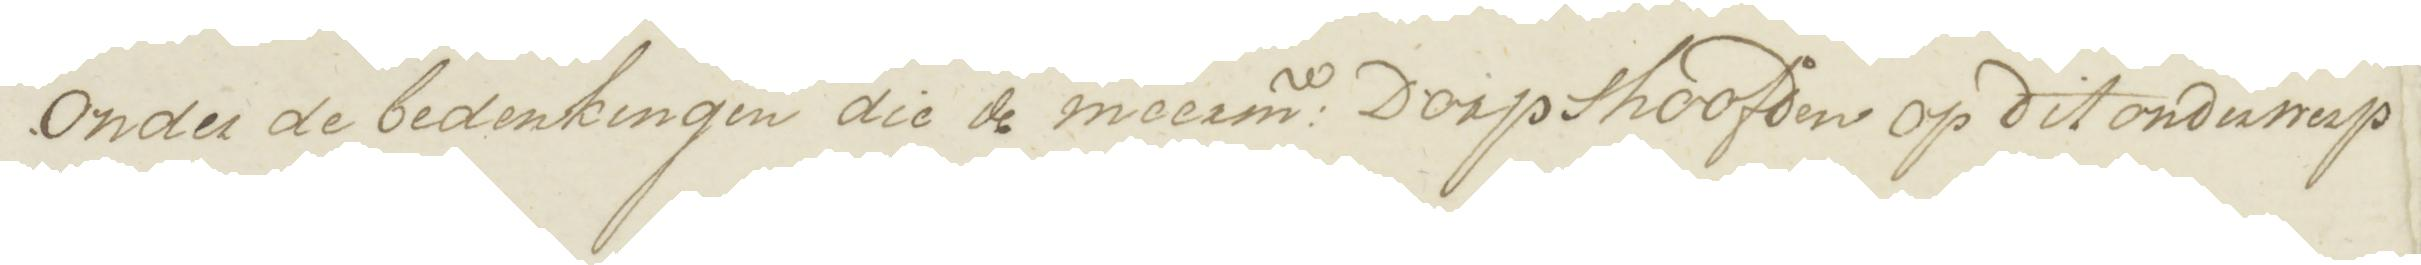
Onder de bedenkingen die de meerm: Dorpshoofden op dit onderwerp
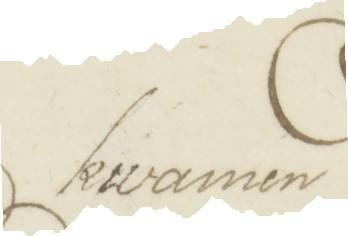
kwamen
